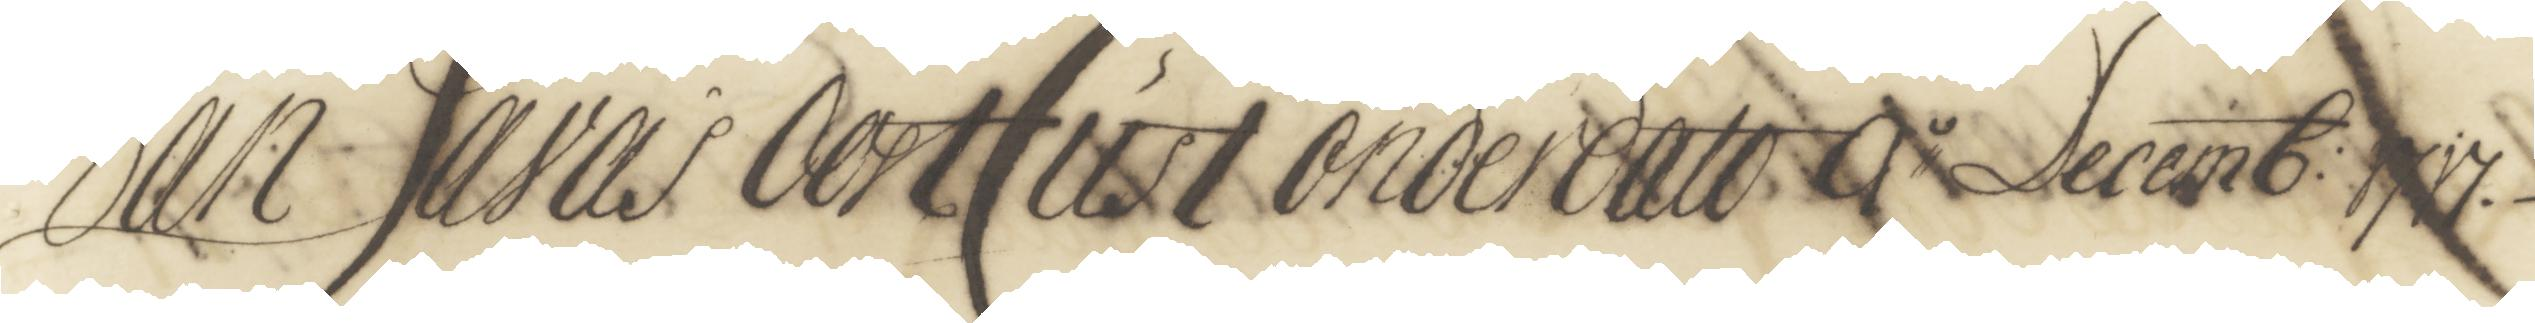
Van Java's Oost Cust onder dato 4„e Decemb: 1717.
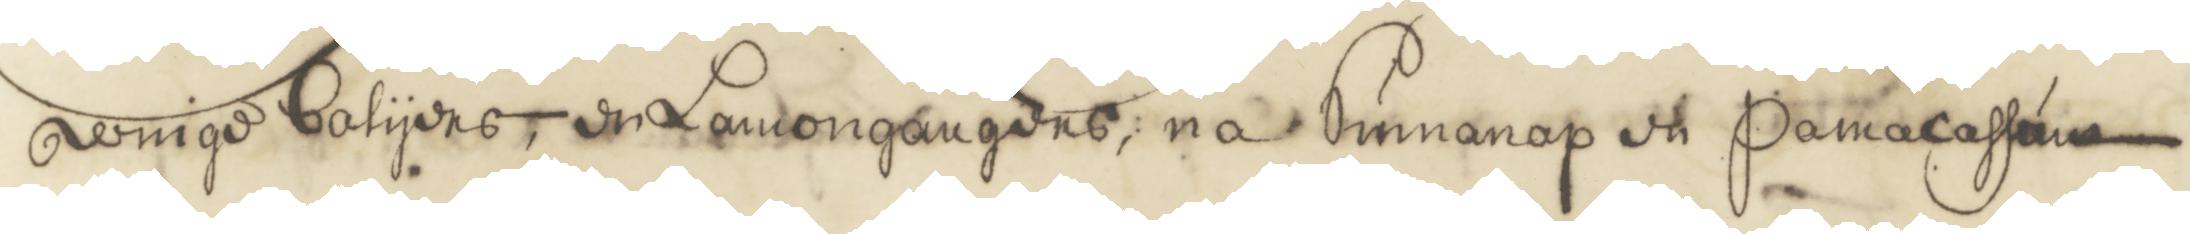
eenige balijers, en Lamongangers, na sumanap en pamacassuw
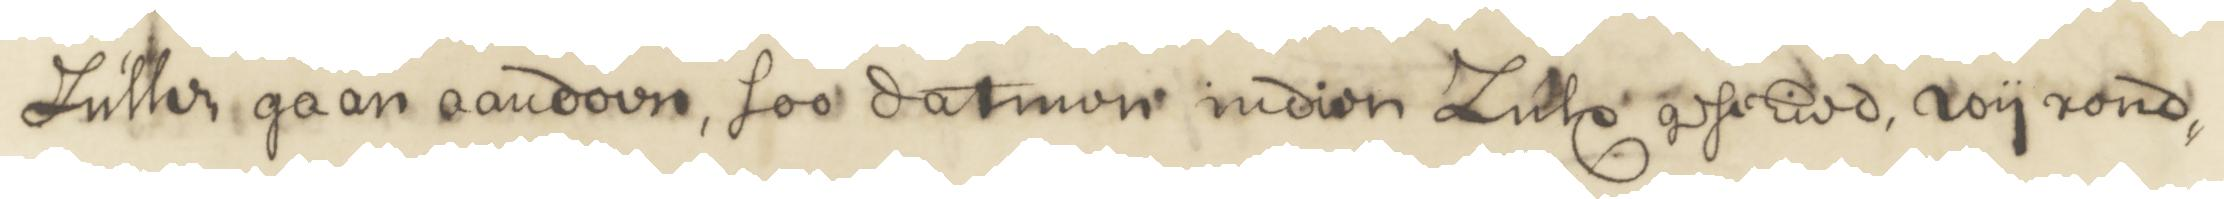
zullen gaan aandoen, soo datmen indien zulx geschied, wij rond„
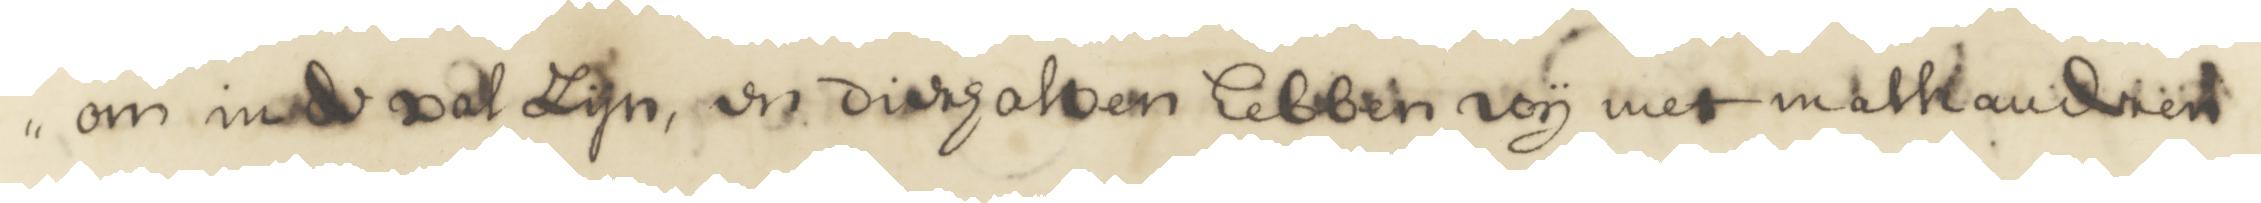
„om in de val zijn, en dierhalven hebben wij met malkanderen
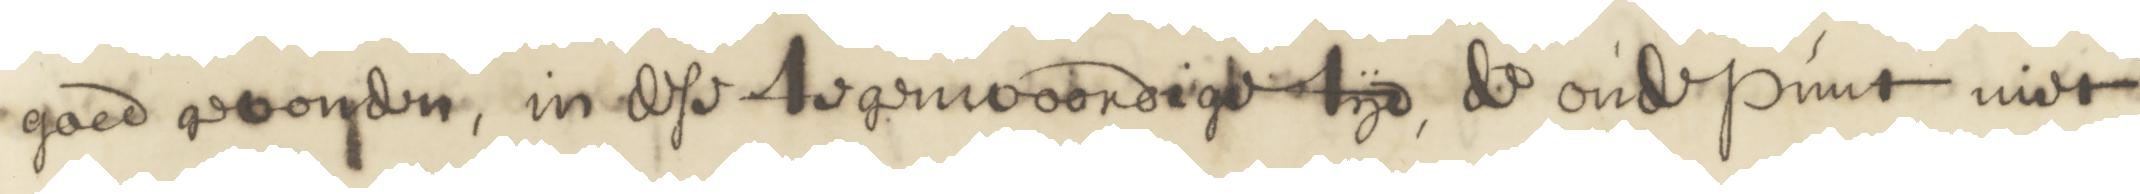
goed gevonden, in dese tegenwoordige tijd, de oude punt niet
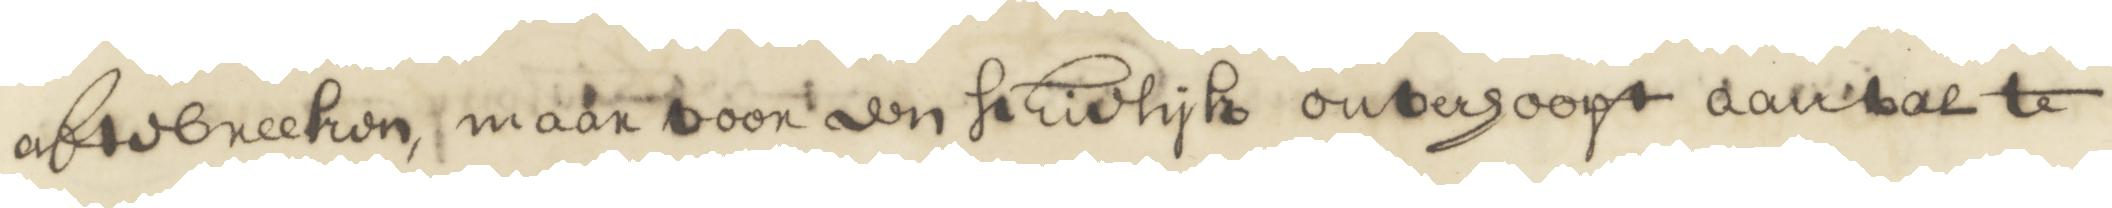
aftebreeken, maar voor een schielijk onverhoopt aanval te
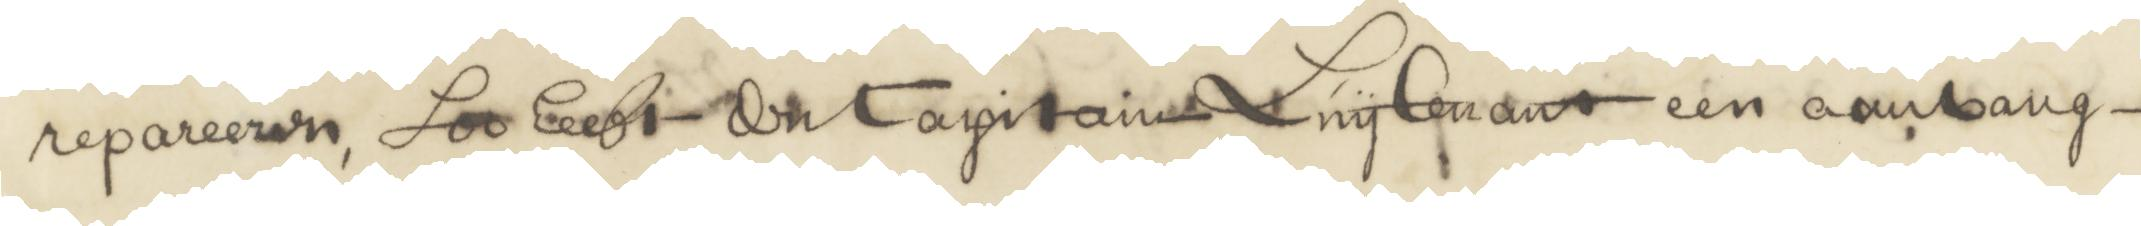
repareeren, soo heeft den capitain Luijtenant een aanvang
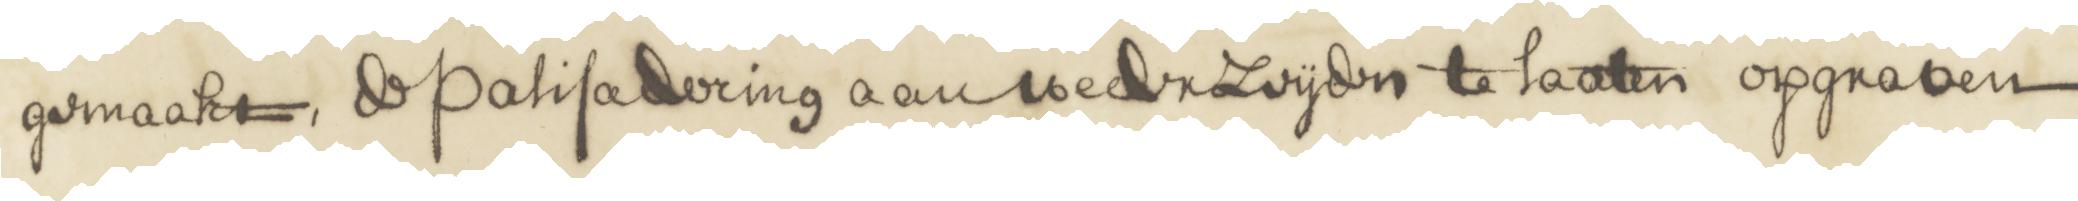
gemaakt, de palisadering aan weder zeijden te laaten opgraven
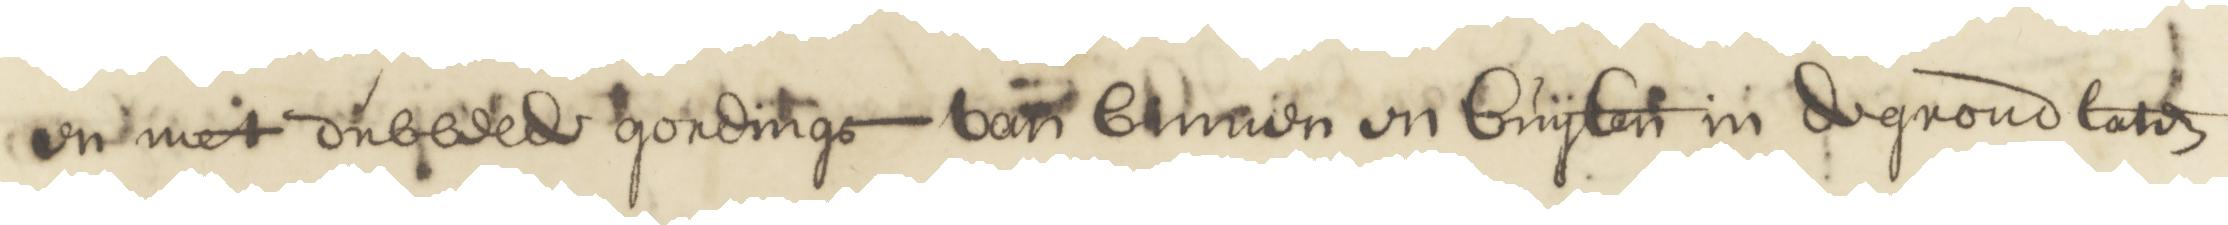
en met dubbelde gordings van binnen en buijten in de grond laten
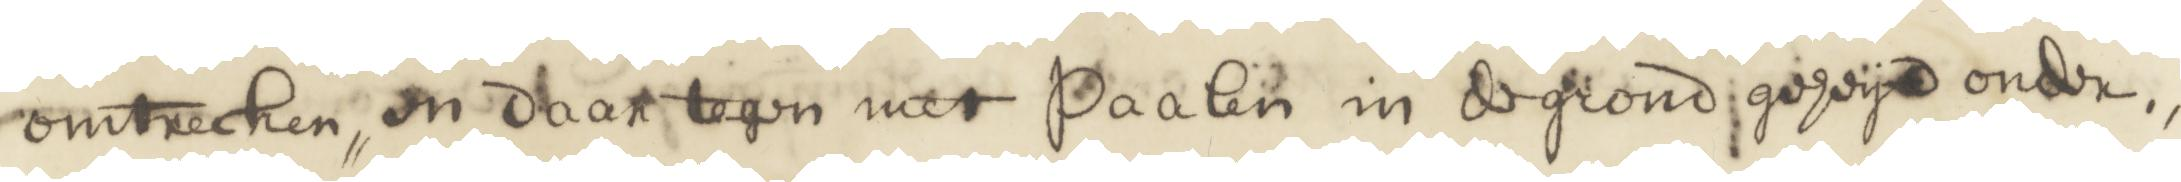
omtrecken„ en daar tegen met paalen in de grond geheijd onder„
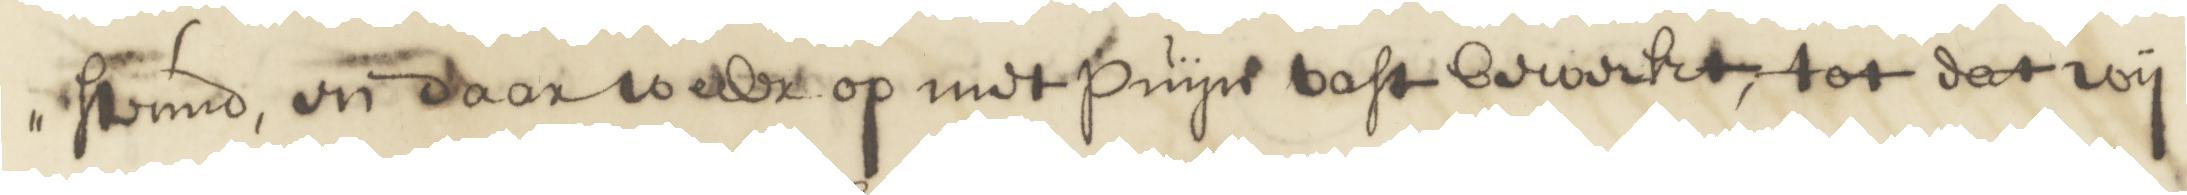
„steund, en daar weder op met puijn vast bewerkt, tot dat wij
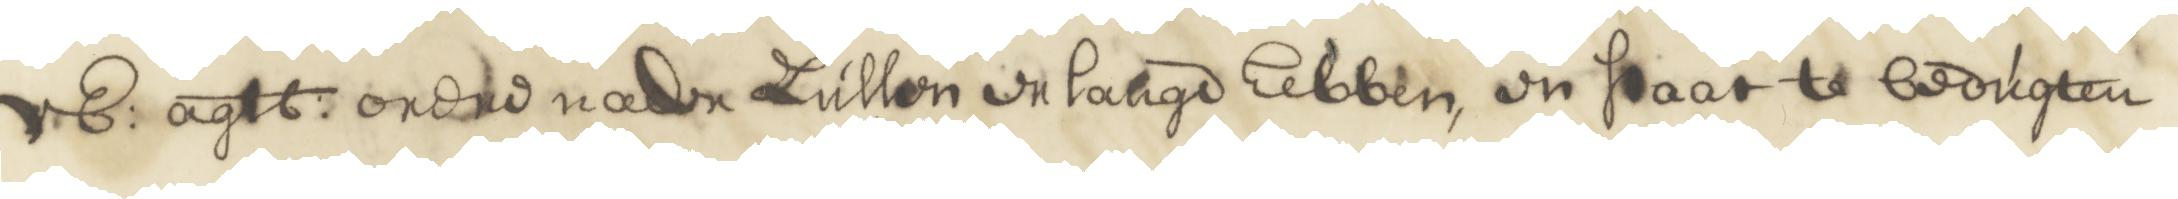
vE: agtb: ordre nader zullen erlangd hebben, en staat te bedugten
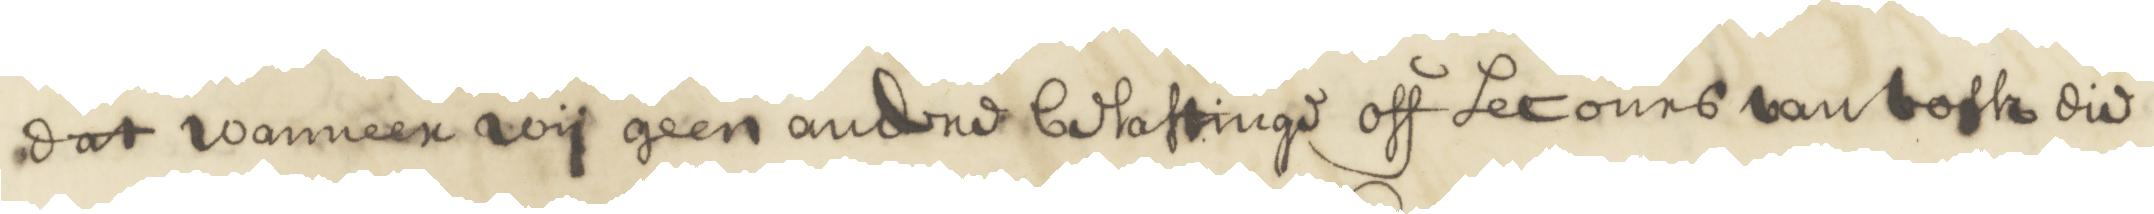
dat wanneer wij geen andere belastinge off secours van volk die
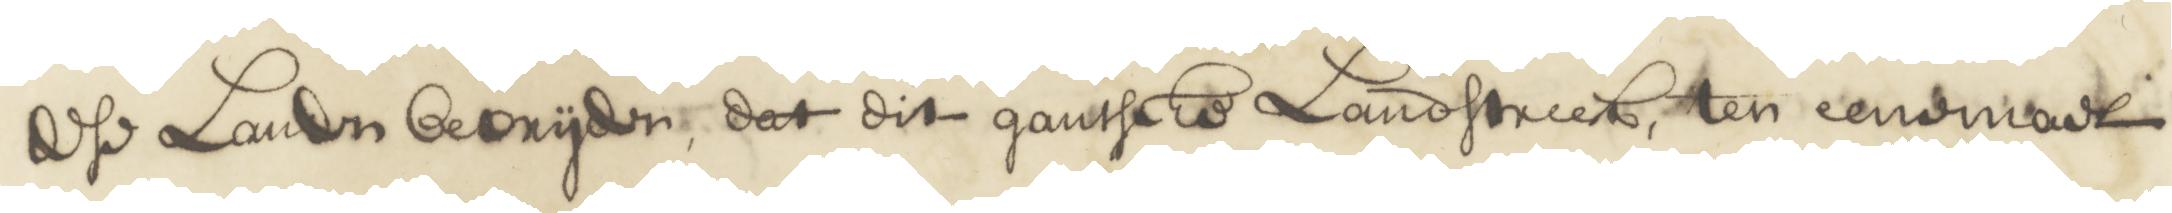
dese Landen bevrijden, dat dit gantsche Landstreek, ten eenemael
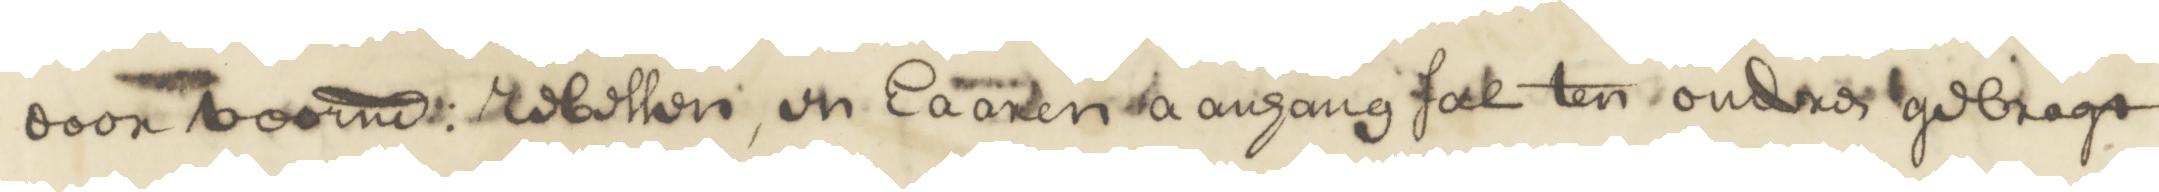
door voorm: rebellen, en haaren aanhang sal ten onderen gebragt
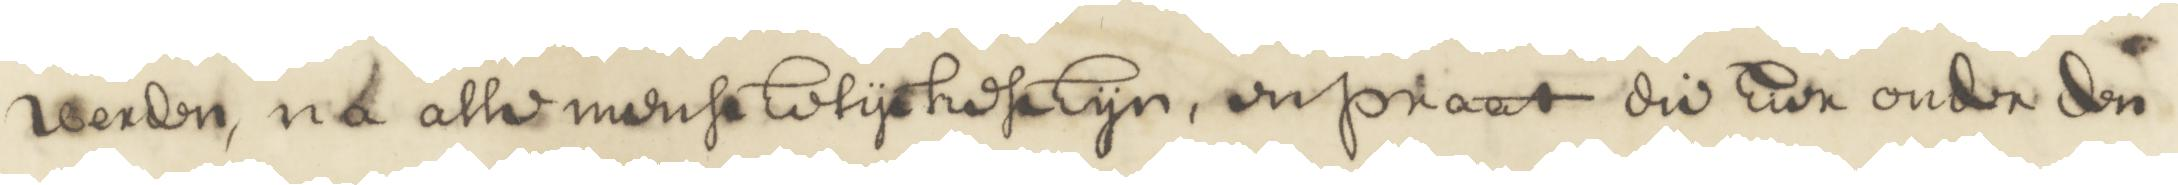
werden, na alle menschelijckeschijn, en praat die hier onder den
